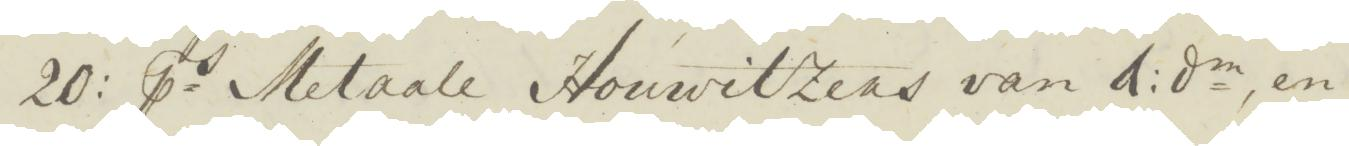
20: p=s Metaale Houwitzers van 4: d=m, en
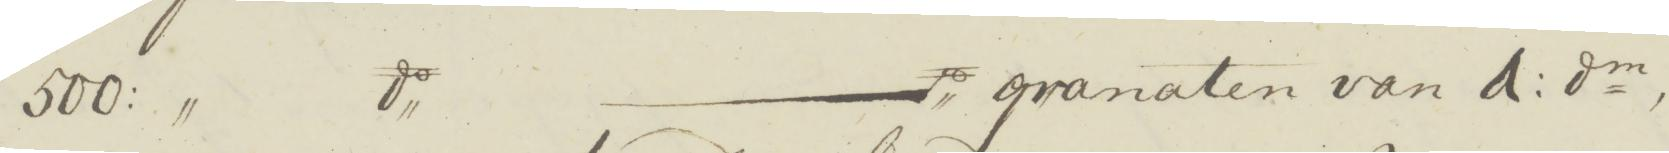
500: „ d„o _„o granaten van 4: d=m,
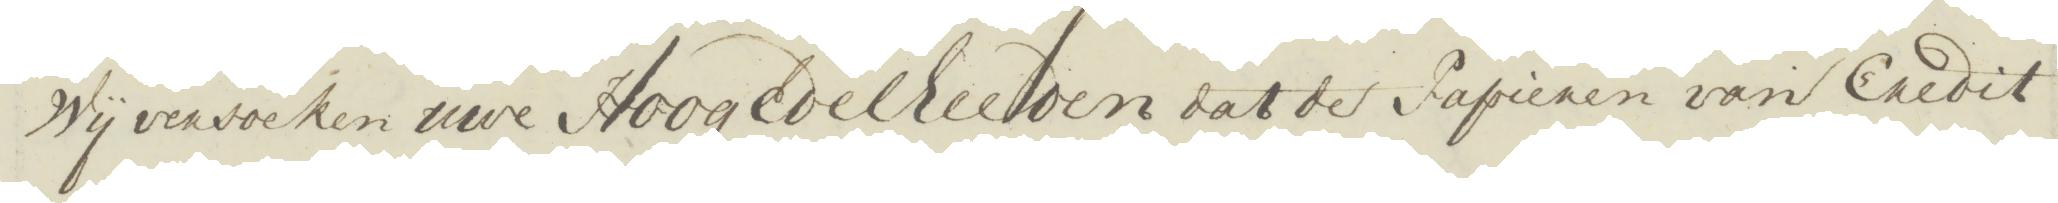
Wij versoeken uwe Hoog Edelheeden dat de Papieren van Credit
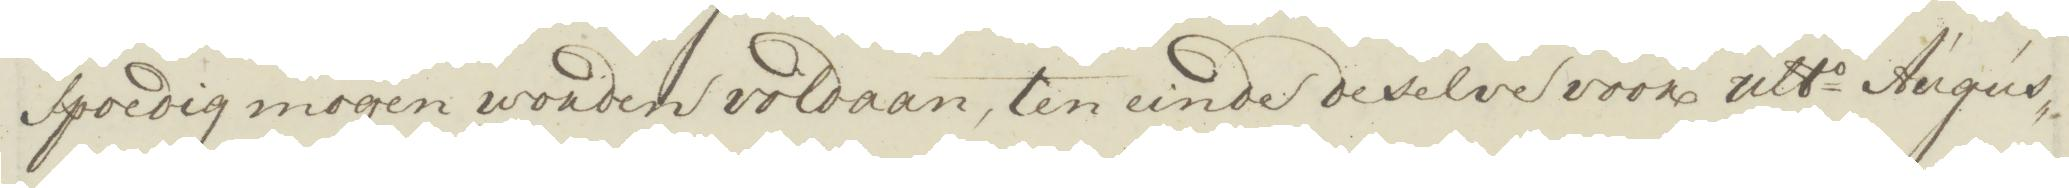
spoedig mogen worden voldaan, ten einde deselve voor ult=o Augus„
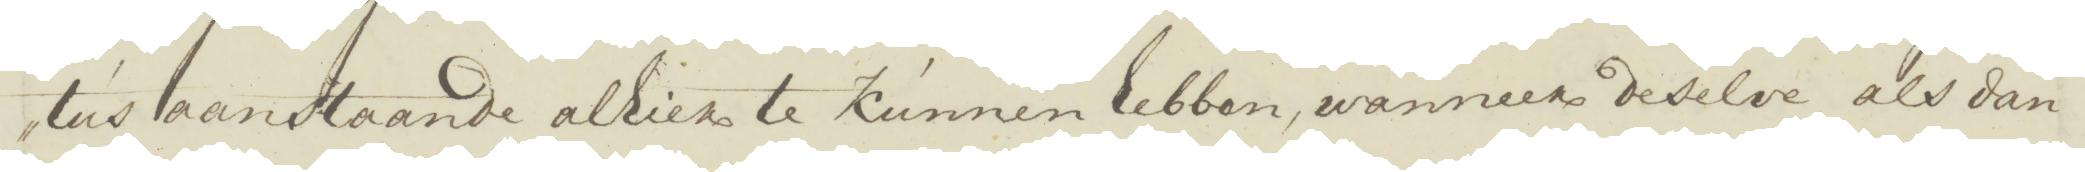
„tus aanstaande alhier te kunnen hebben, wanneer deselve als dan
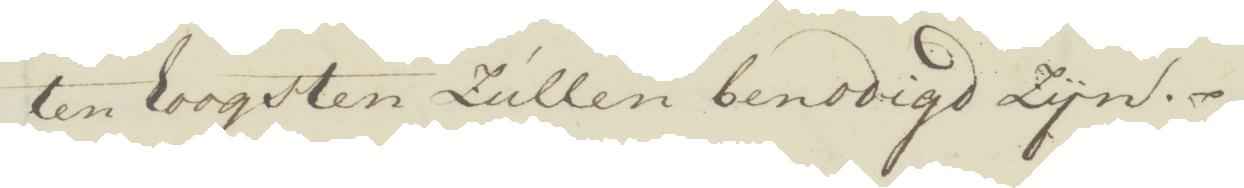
ten hoogsten zullen benodigd zijn. —
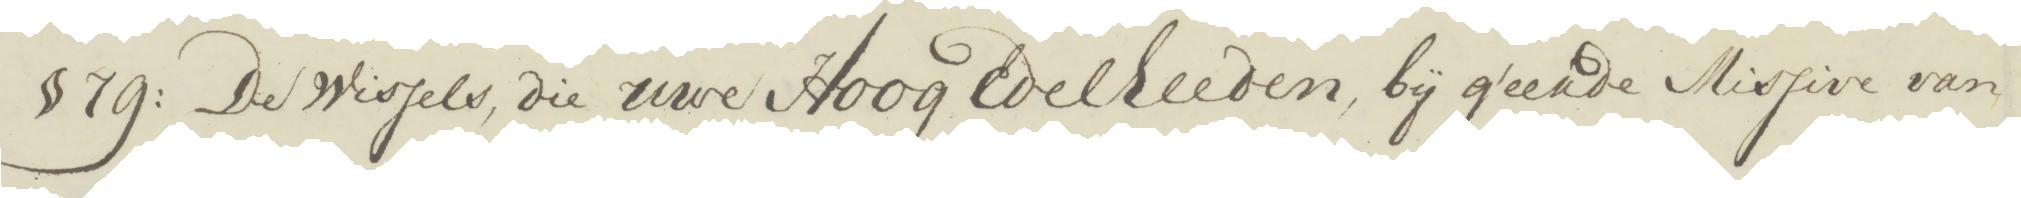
§ 79: De wissels, die uwe Hoog Edelheeden, bij g'eerde Missive van
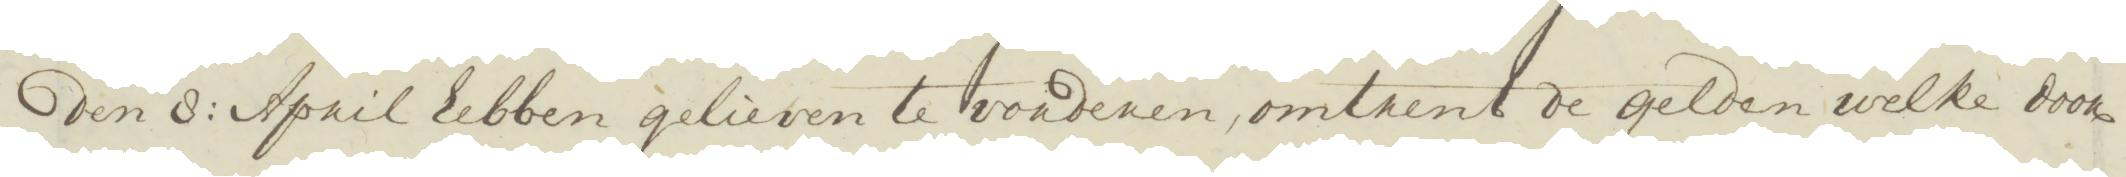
den 8: April hebben gelieven te vorderen, omtrent de gelden welke door
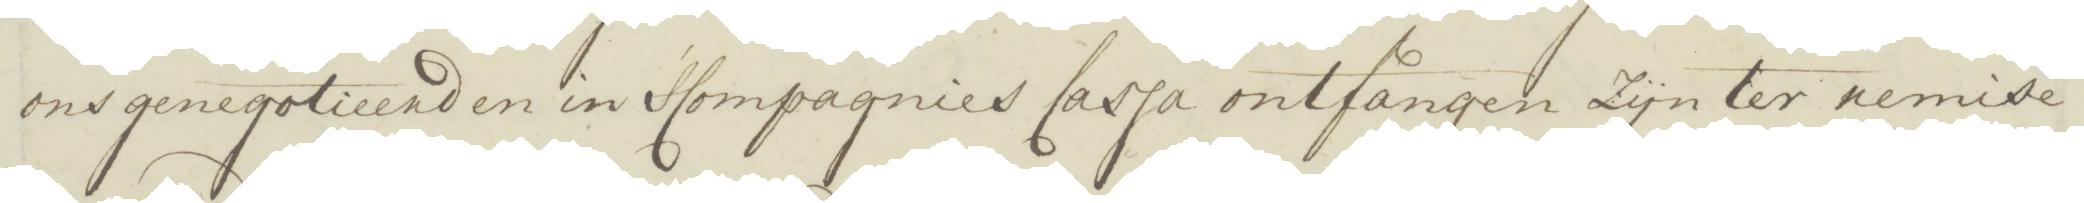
ons genegotieerd en in 'sCompagnies Cassa ontfangen zijn ter remise
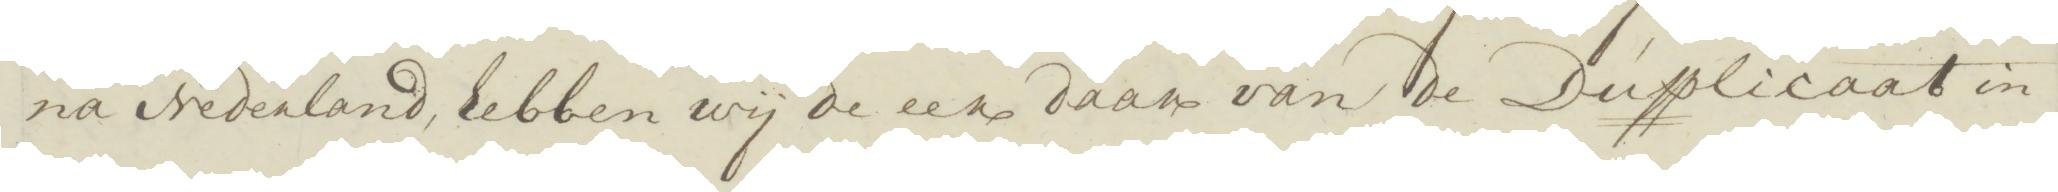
na Nederland, hebben wij de eer daar van de Dupplicaat in
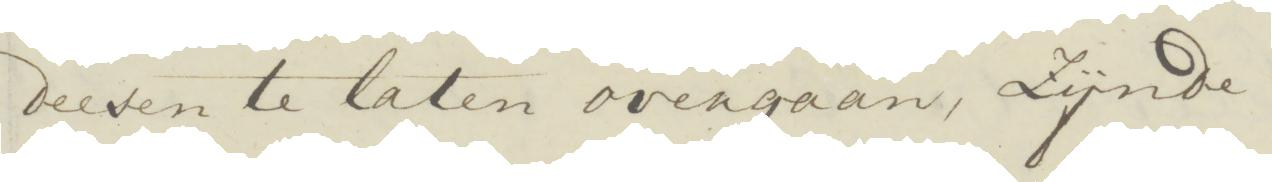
deesen te laten overgaan, zijnde
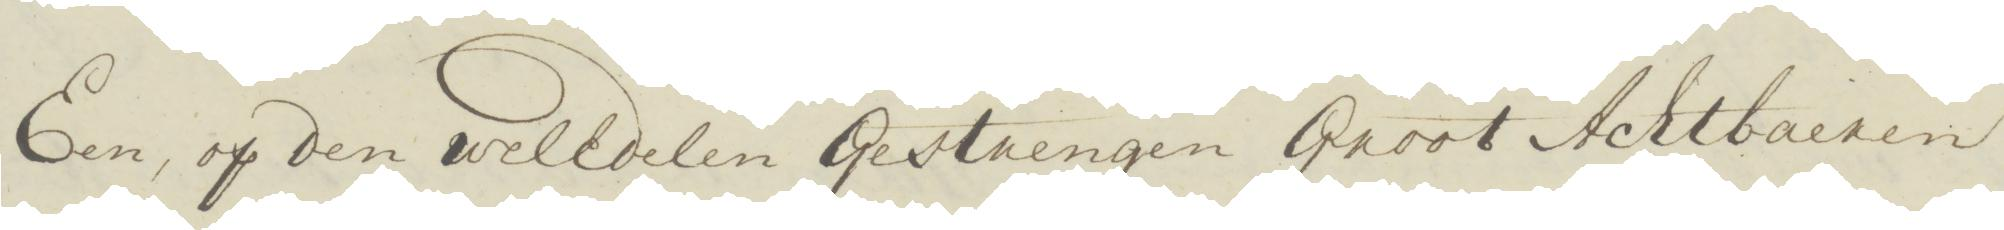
Een, op den welEdelen Gestrengen Groot Achtbaeren
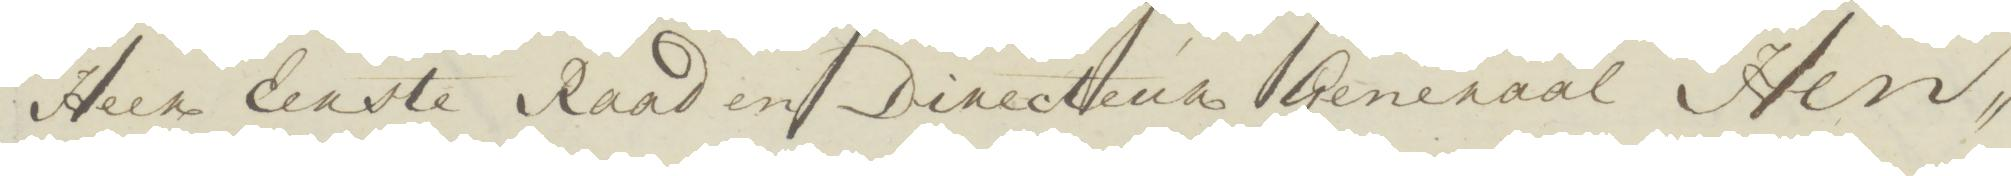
Heer Eerste Raad en Directeur Generaal Hen„
